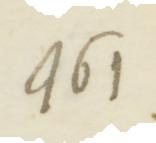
461
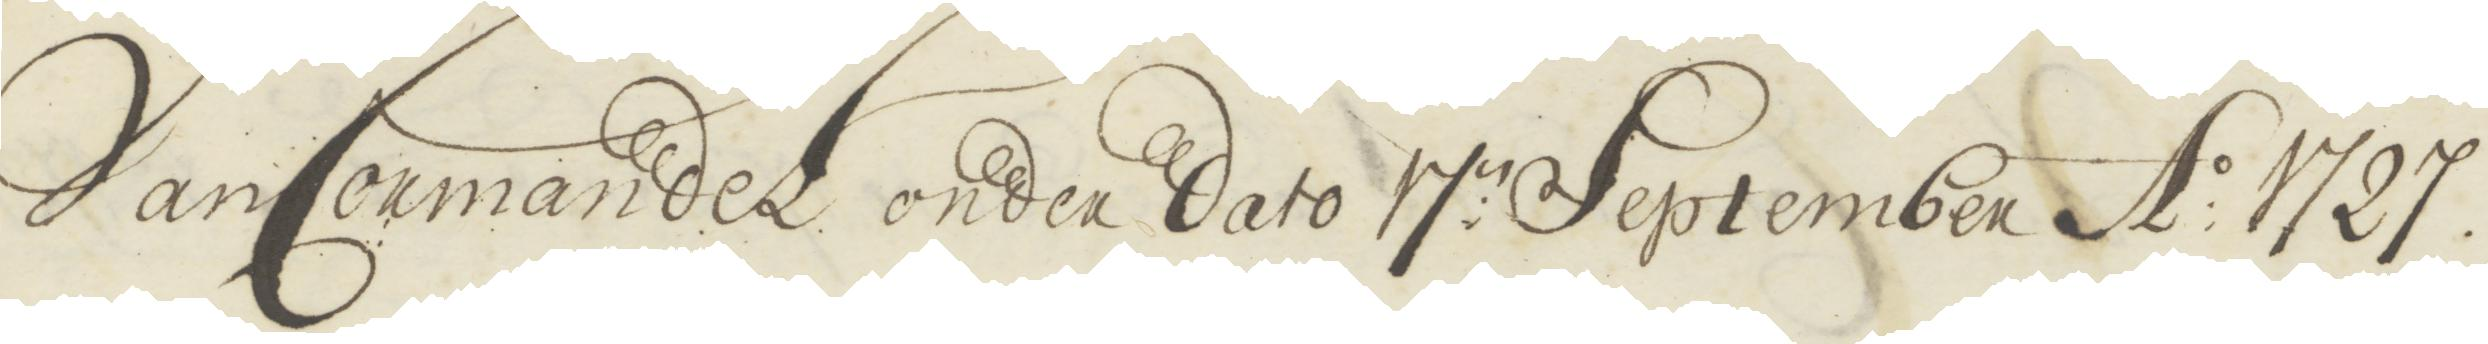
Van Cormandel onder dato 17:e September A:o 1727.
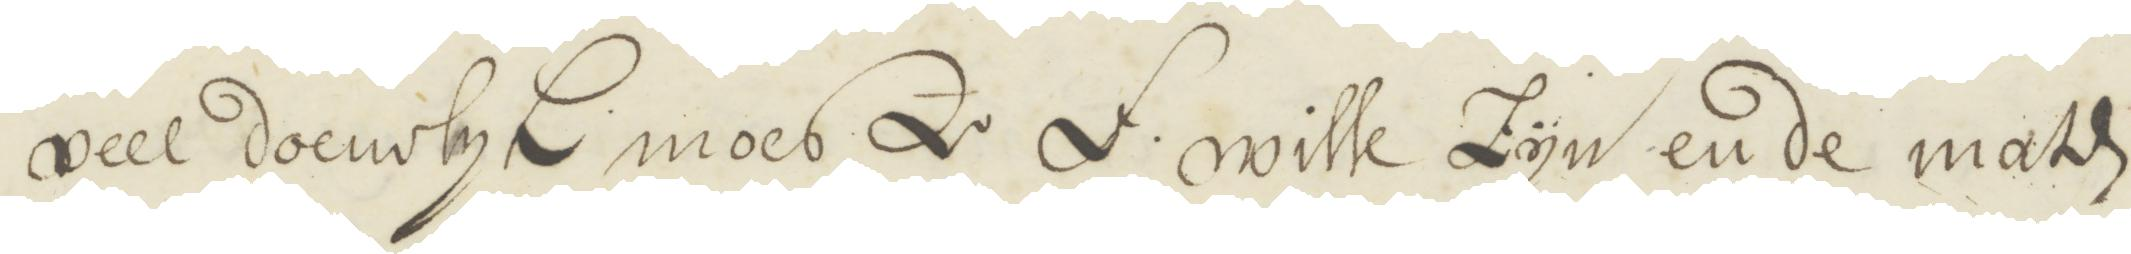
veel doenelyk moeste te wille zijn en de maten
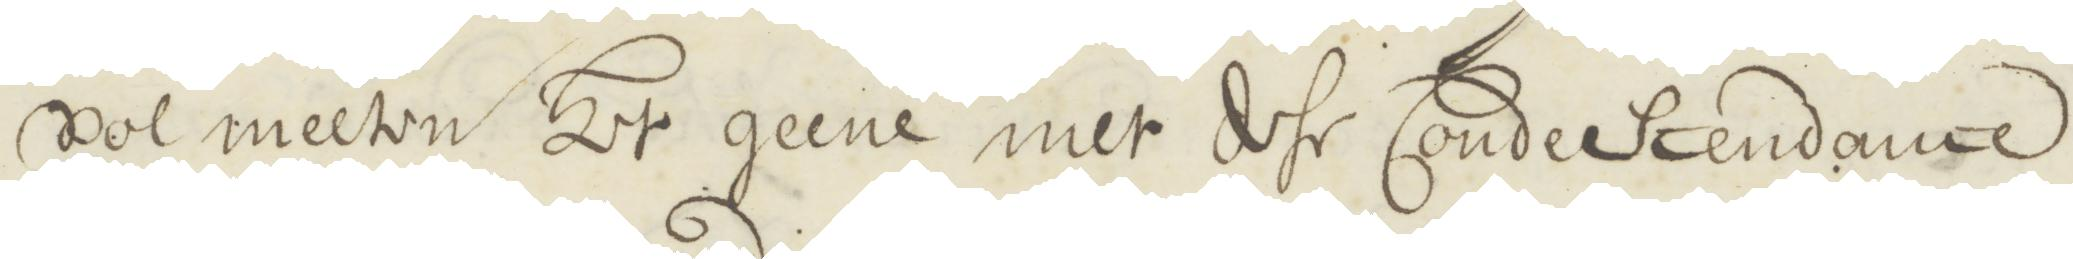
vol meeten het geene met dese Condescendance
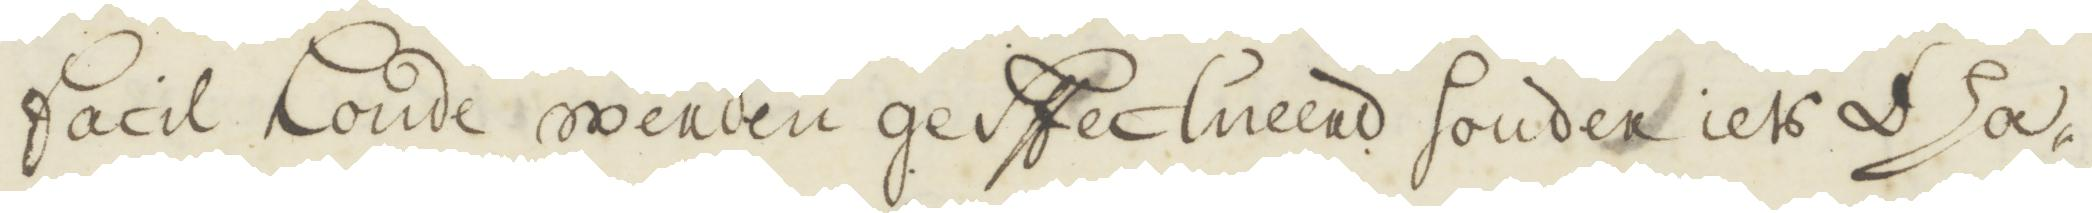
facil konde werden geeffectueerd sonder iets te ha„
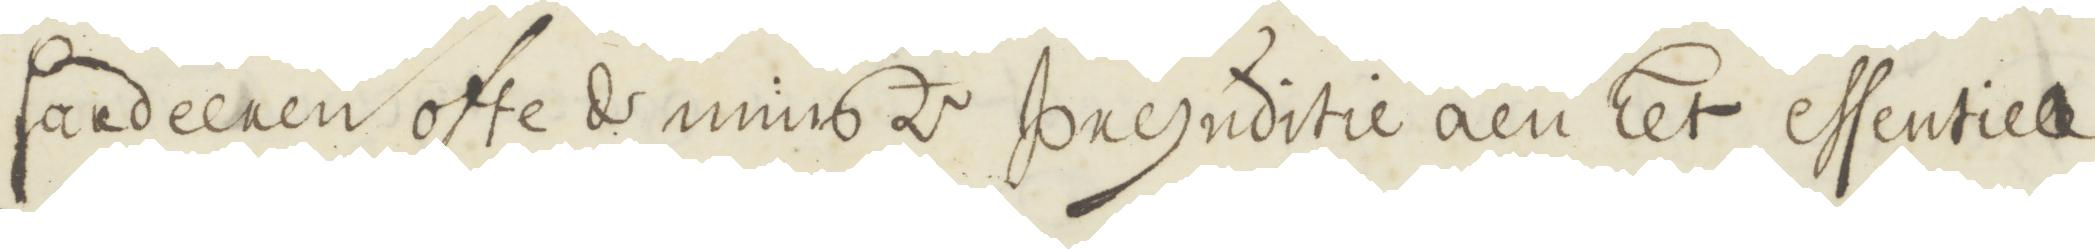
sardeeren ofte de minste prejuditie aen het essentiele
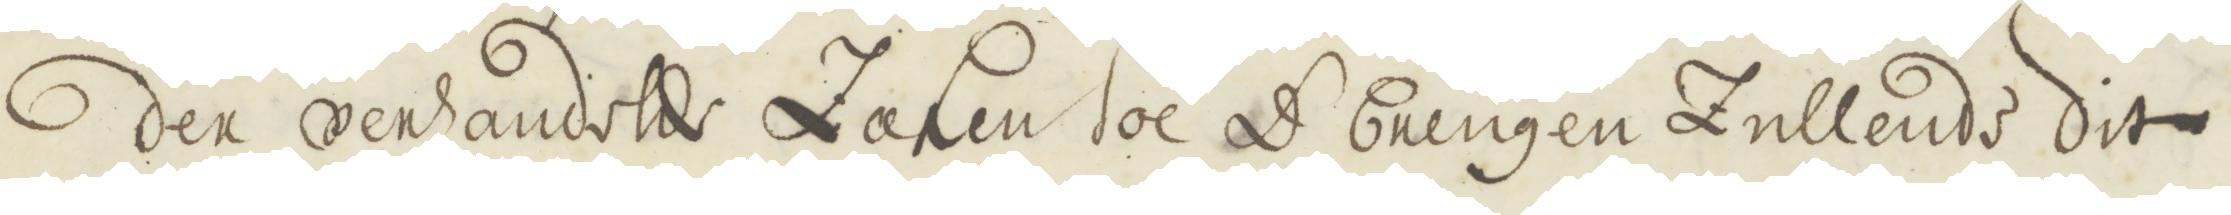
der verhandelde Zaken toe te brengen Zullende dit
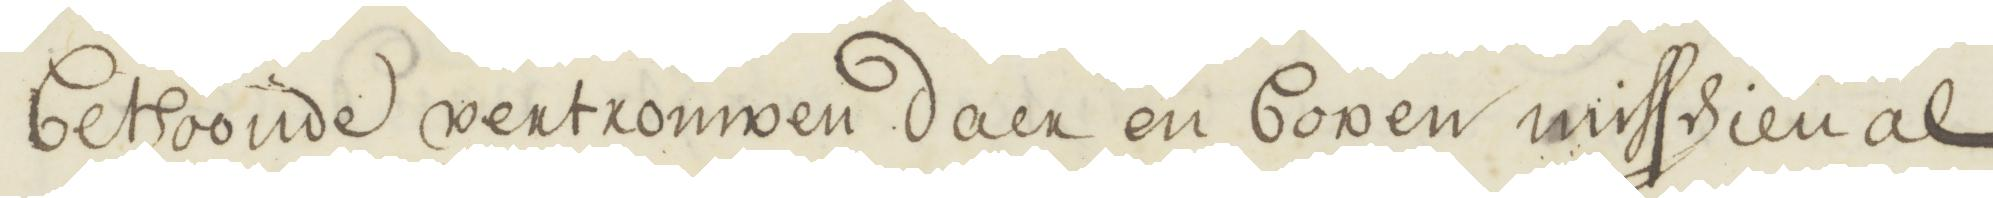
bethoonde vertrouwen daer en boven misschien al
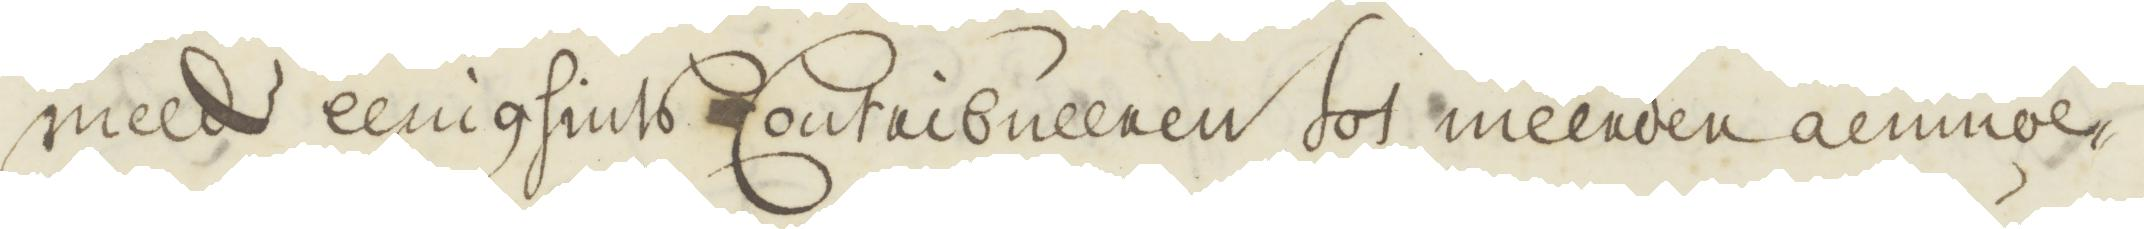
meede eenigsints Contribueeren tot meerder aenmoe„
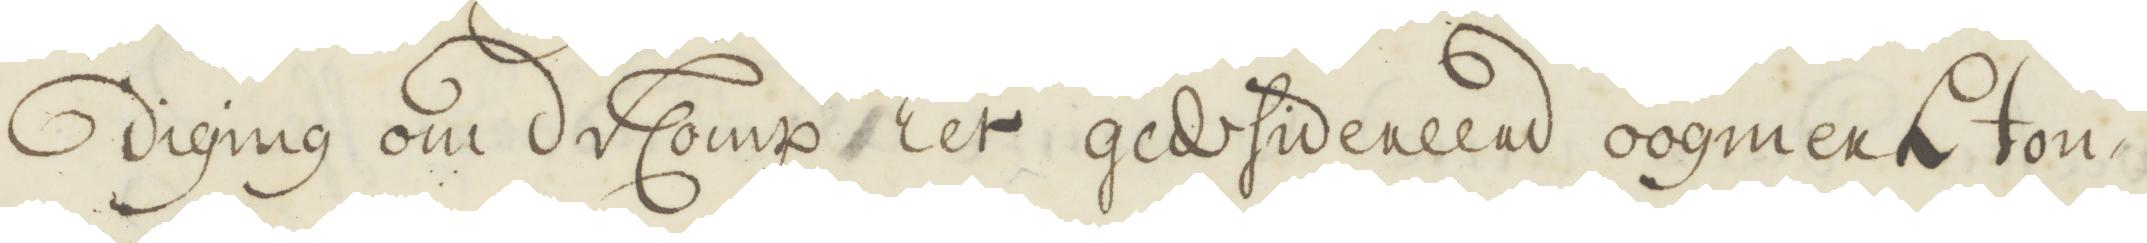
diging om d E Comp het gedesidereerd oogmerk tou„
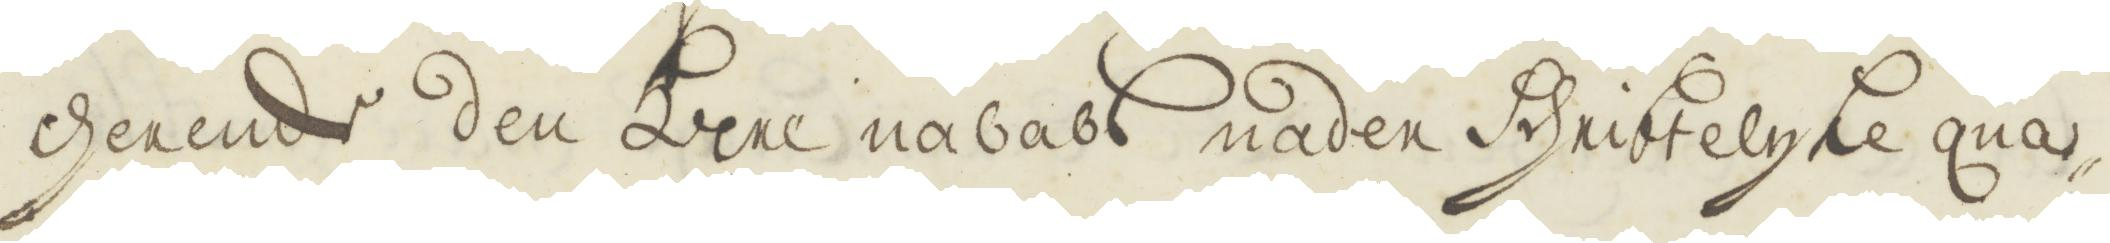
cherende den Heere nababs nader schriftelyke qua„
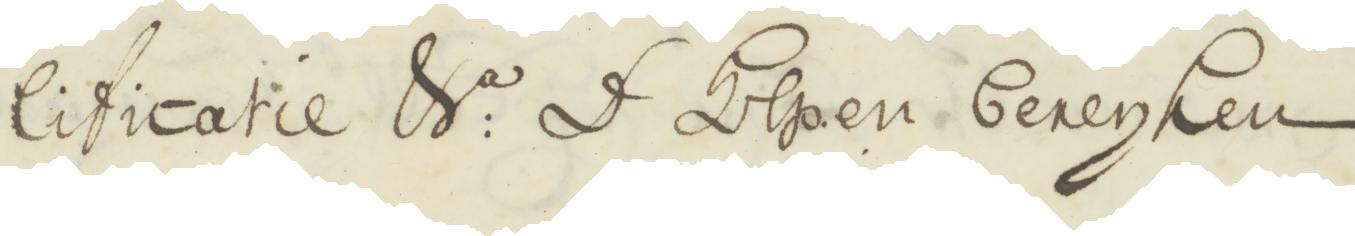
lificatie &:a te helpen bereyken
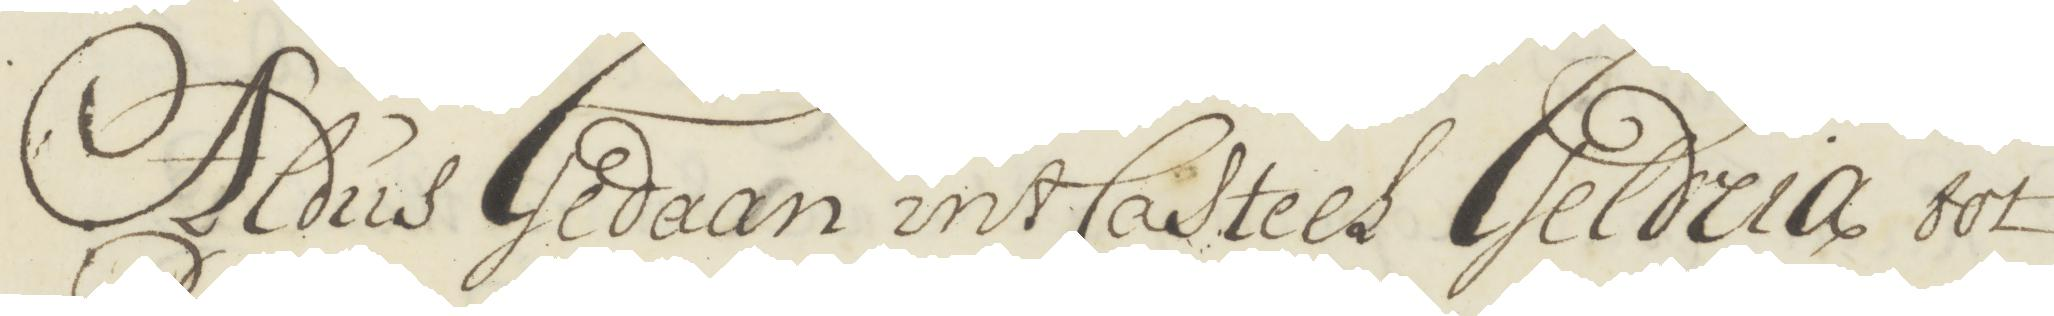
Aldus Gedaan in t Casteel Geldria tot
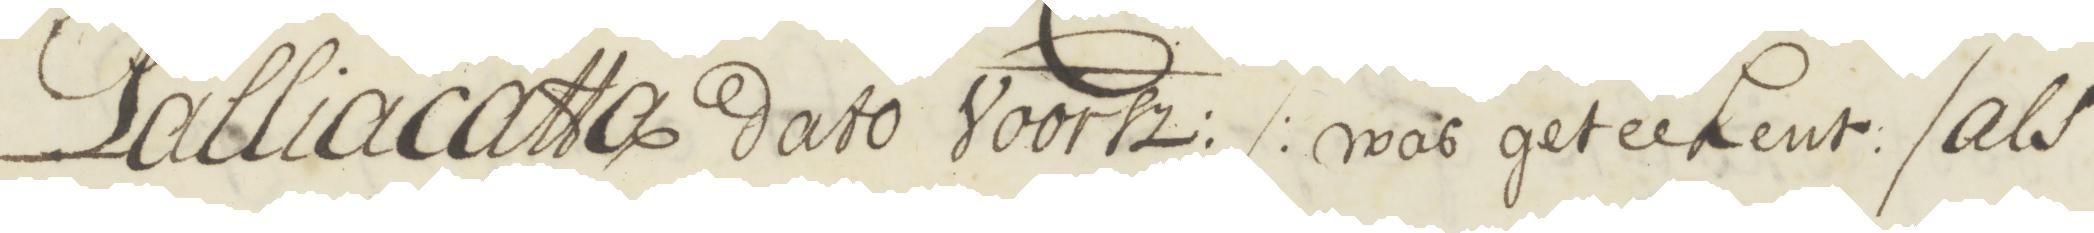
Palliacatta dato voorsz: /: was geteekent:/ als
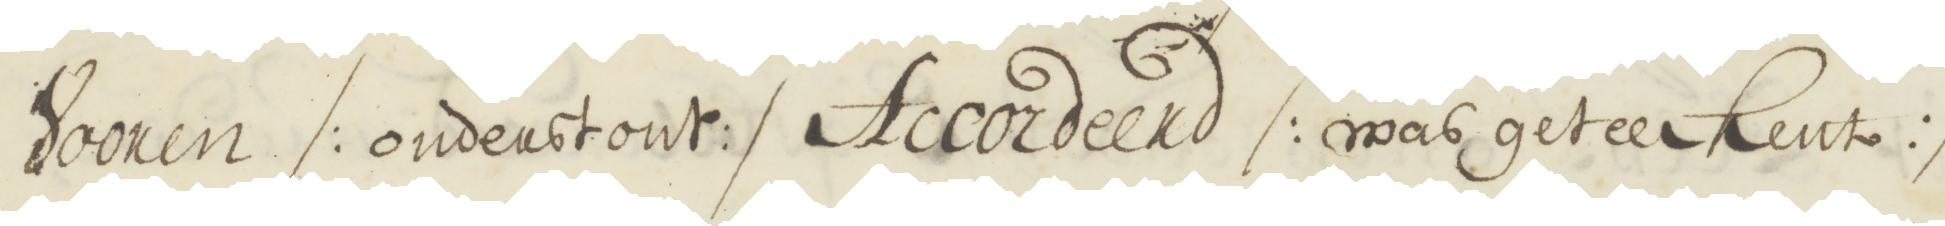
Vooren /: onderstont:/ Accordeerd /: was geteeckent:/
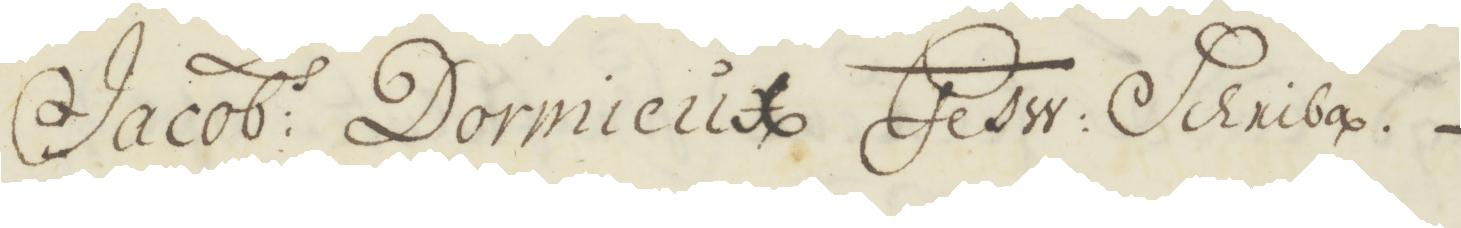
Iacob:s Dormieux Gesw: Schriba. —
